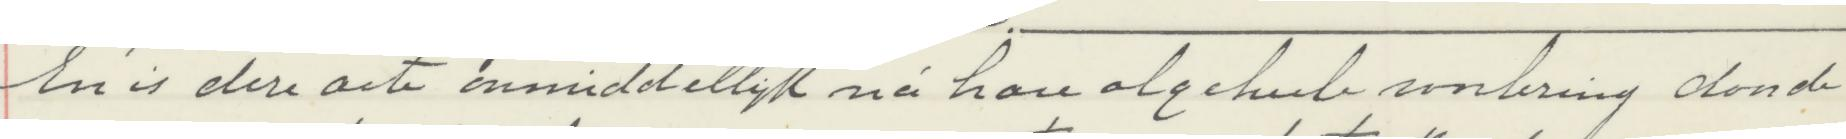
En is deze acte onmiddellijk na hare algeheele voorlezing door de
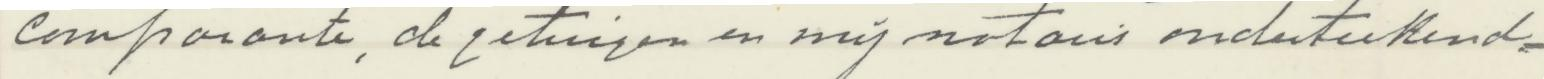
comparante, de getuigen en mij notaris onderteekend.
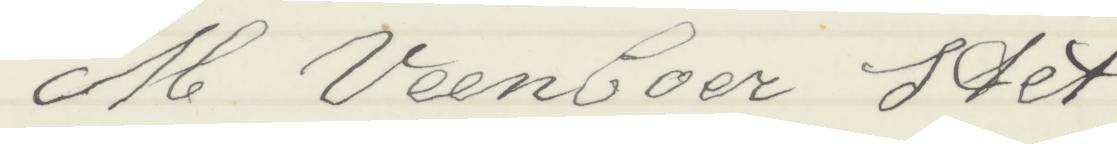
M Veenboer Stet
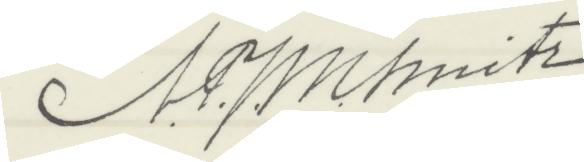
A.P.J.Smitz
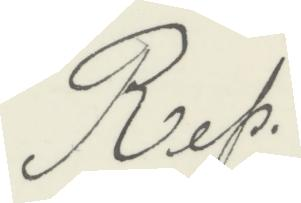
Rep.
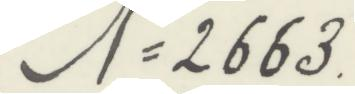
N=o 2663.
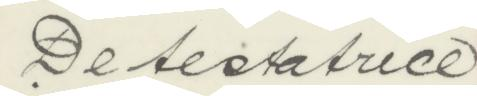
De testatrice
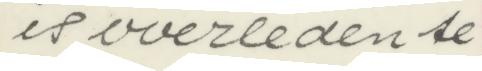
is overleden te
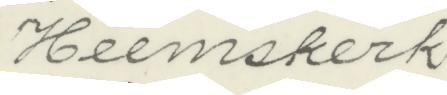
Heemskerk
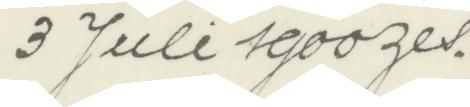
3 Juli 1900zes.
